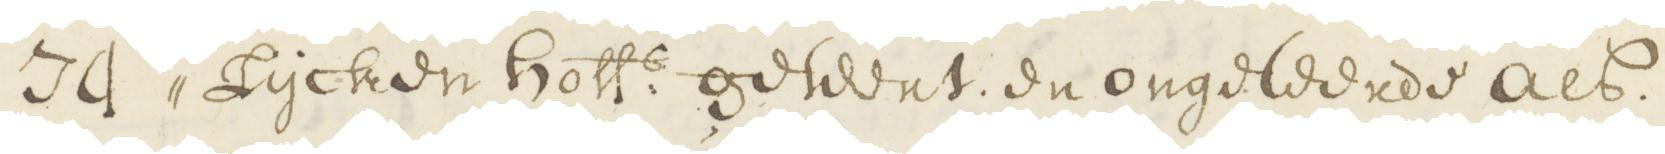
74 „ lijcken hoss:s geteert en ongeteerde als.
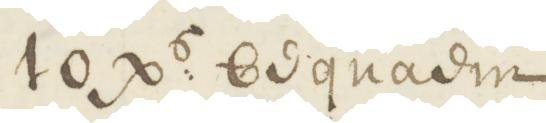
10 p:s bequaem
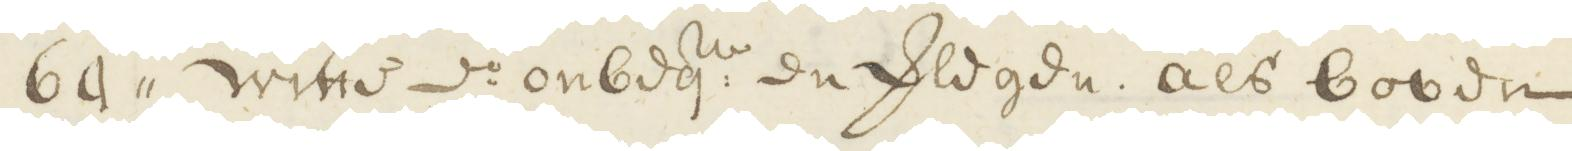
64 „ witte d:o onbeq:m en verlegen als boven
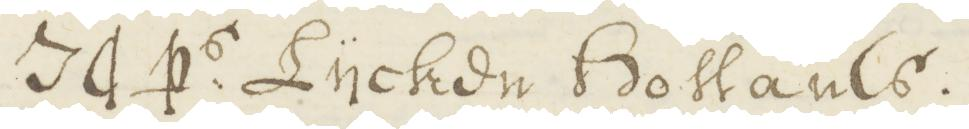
74 p:s lijcken Hollants.
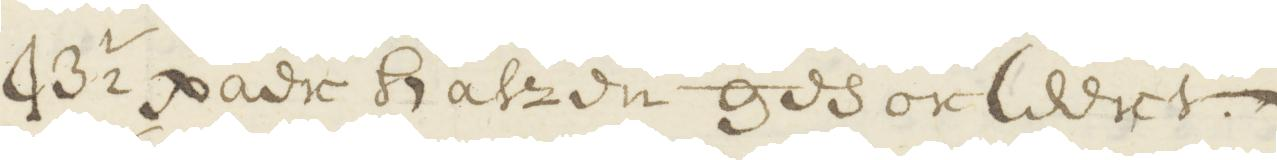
43½ paer halzen gesorteert.
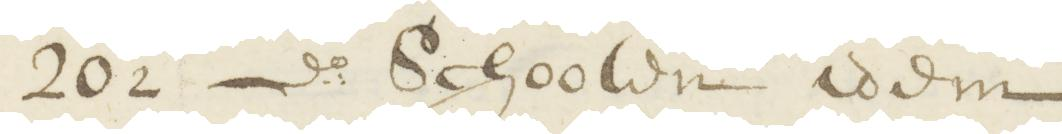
20½ d:o schooten idem
